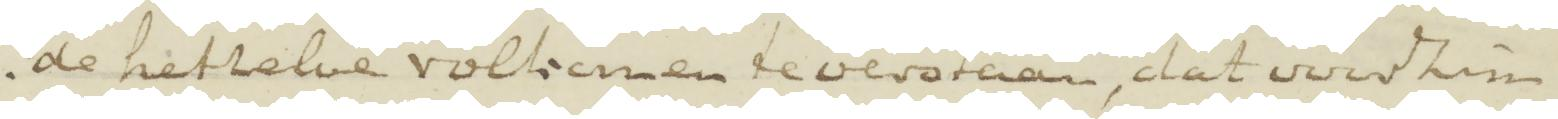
„de hetzelve volkomen te verstaan, dat voor zijn
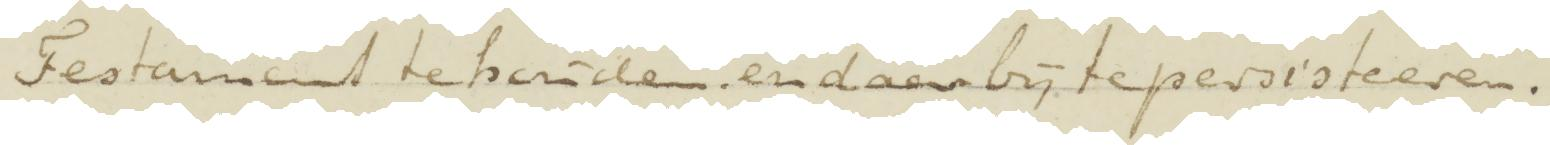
Testament te houden, en daar bij te persisteeren.
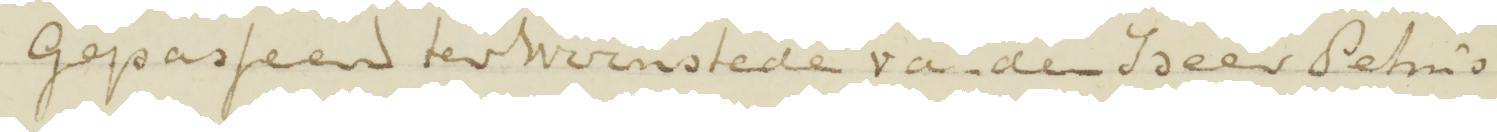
Gepasseerd ter woonstede van den Heer Petrus
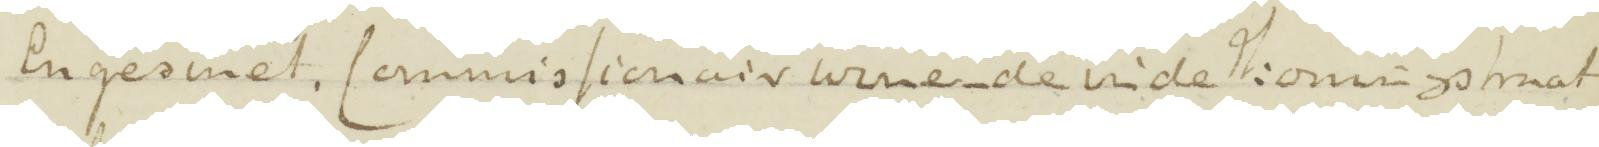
Engesmet, Commissionair wonende in de Koningstraat
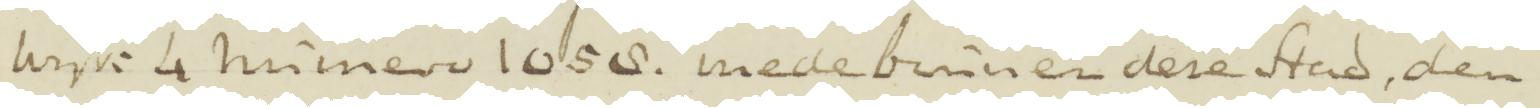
wyk 4 numero 1058. mede binnen deze stad, den
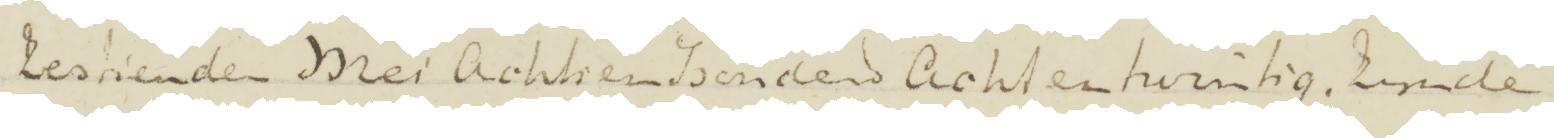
zestienden Mei achtien honderd Acht en twintig, zynde
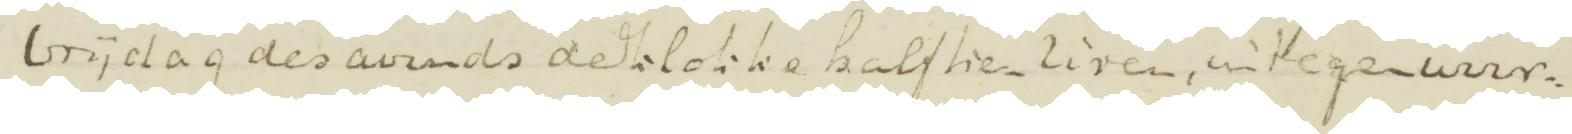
vrijdag des avonds de klokke halftien uren, in tegenwoor=
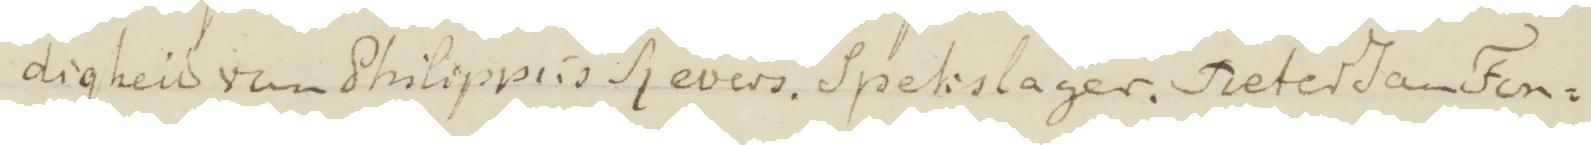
digheid van Philippus Revers, Spekslager, Pieter Jan Fon„
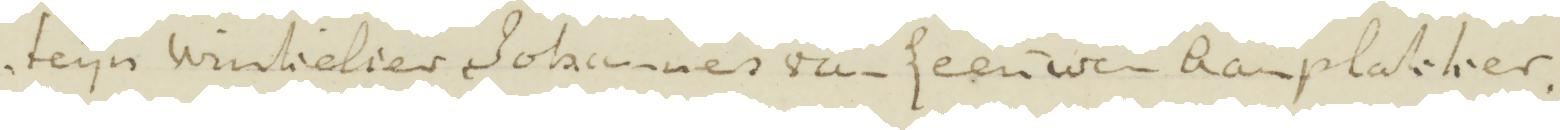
„teijn winkelier, Johannes van Leeuwen Aanplakker,
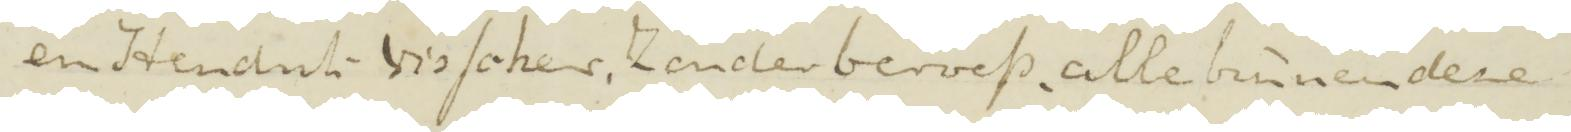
en Hendrik Visscher, zonder beroep, alle binnen deze
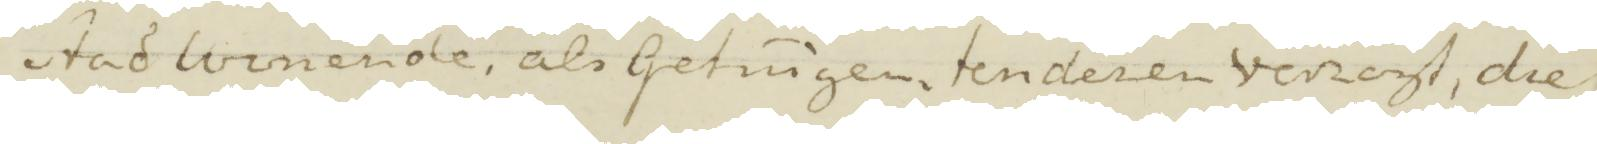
stad wonende, als Getuigen, ten dezen verzogt, die
